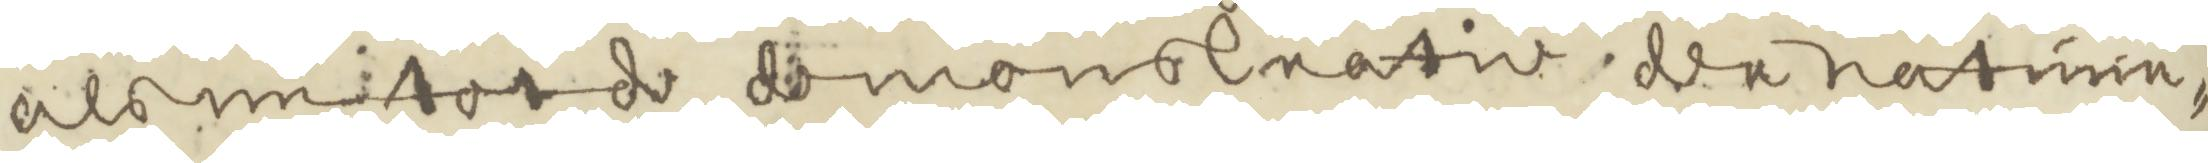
als nu tot de demonstratie der natuur
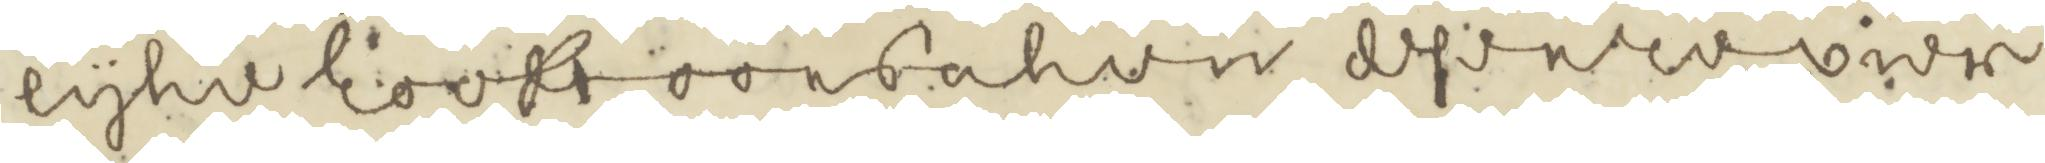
lijke hooftoorsaken deser revier
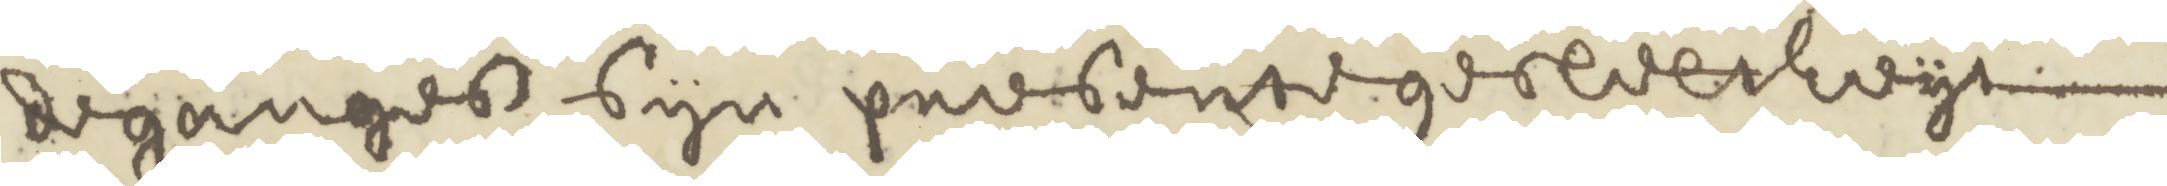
de ganges sijn presente gesteltheijt
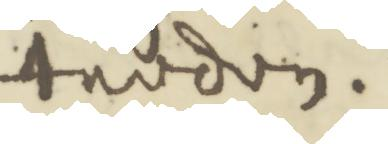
treden.
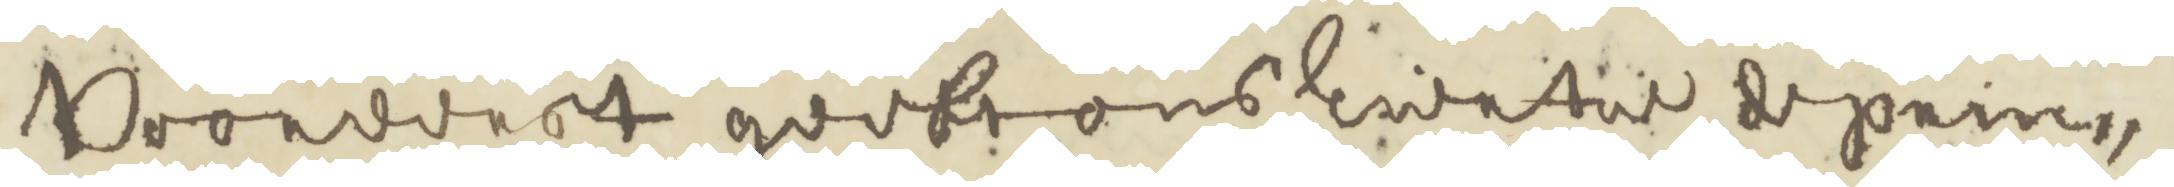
Vooreerst geeft ons hiertoe de prin„
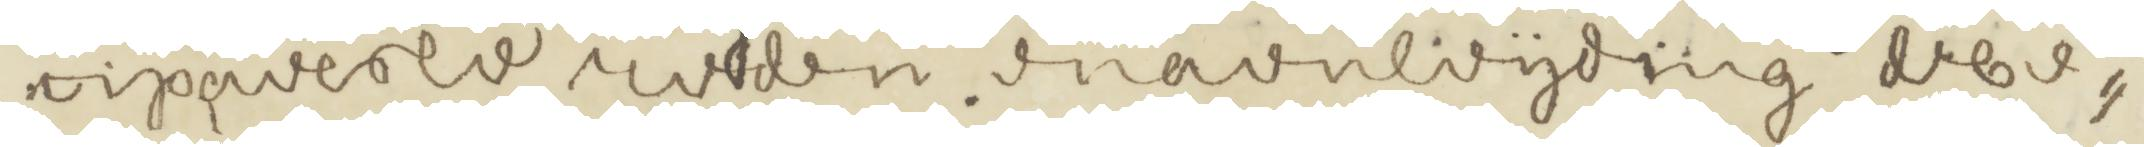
cipaelste reden en aenleijding de be„
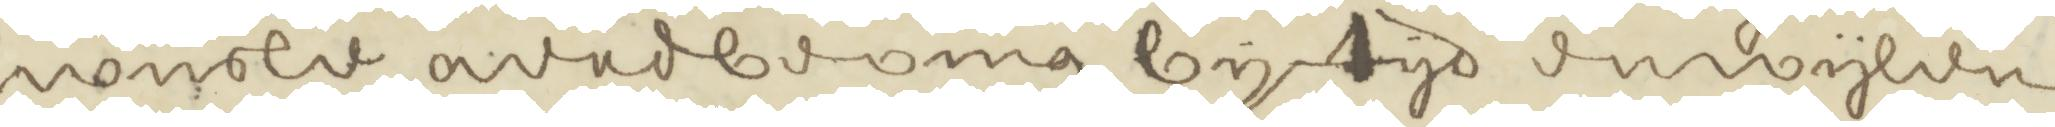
wuste aerdbeving bij tijd en wijlen
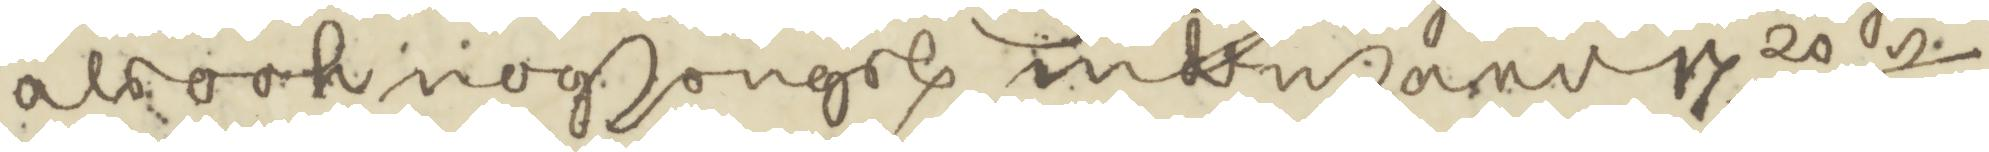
als ook nog Jongst in den Jare 1720/22 is voor„
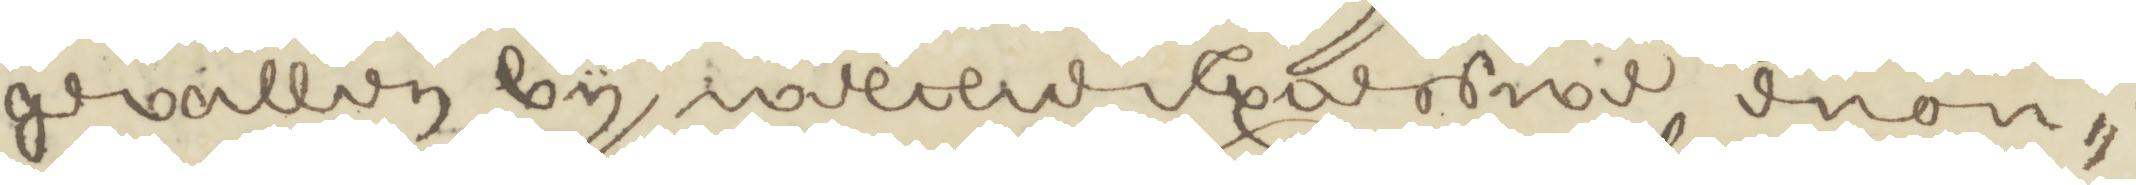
gevallen bij, welcke Excessive, en on„
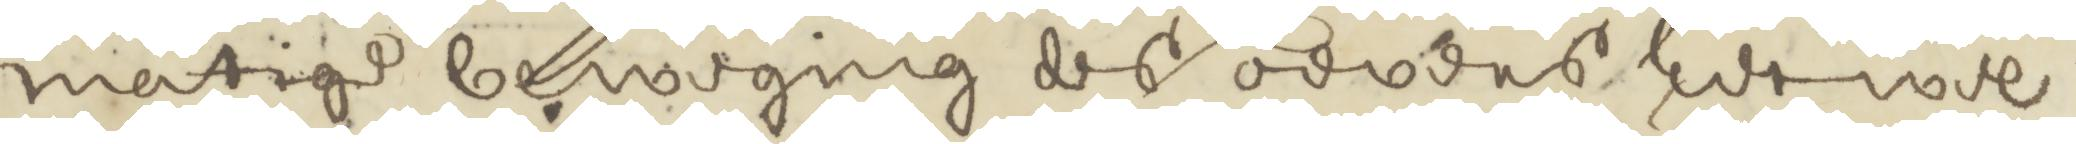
matige beweging des oevers het wel
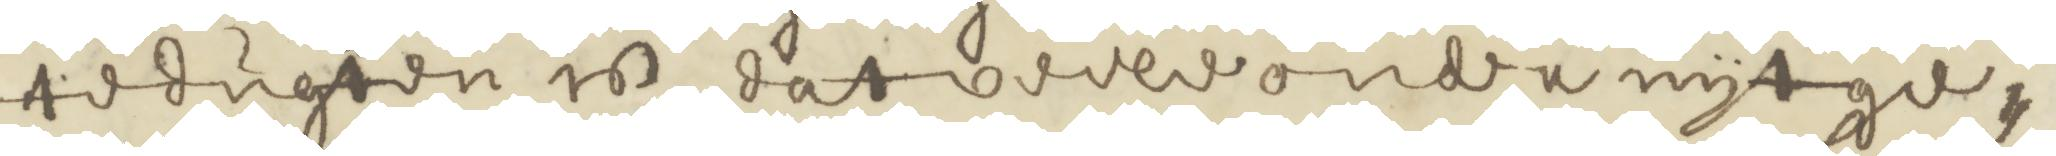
te dugten is, dat veele onder uijtge„
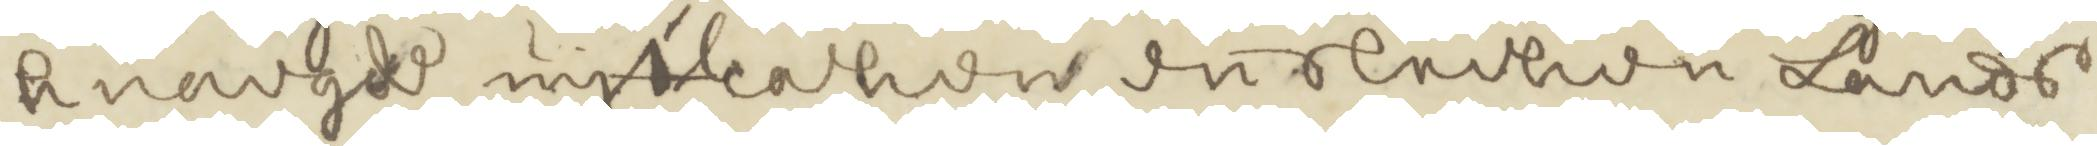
knaegde uijthoeken en streken Lands
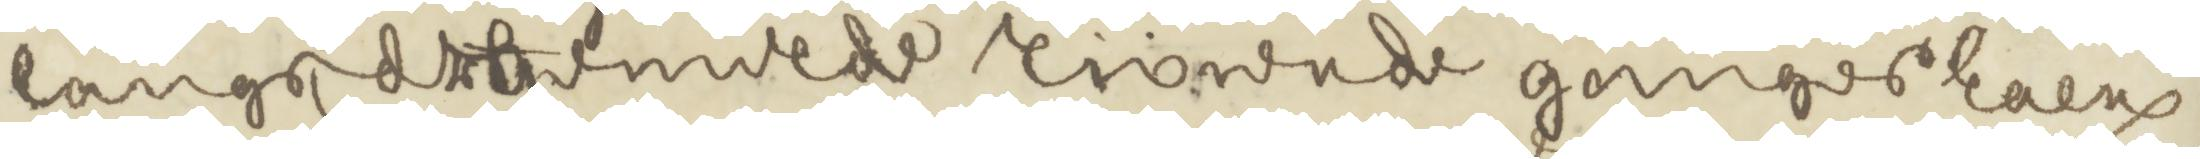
langs der gemelde Rivier de ganges haer
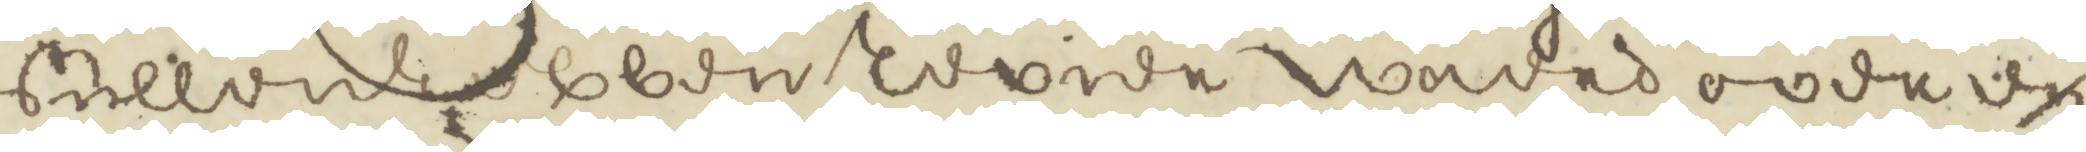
sullen hebben Revier waerd over en
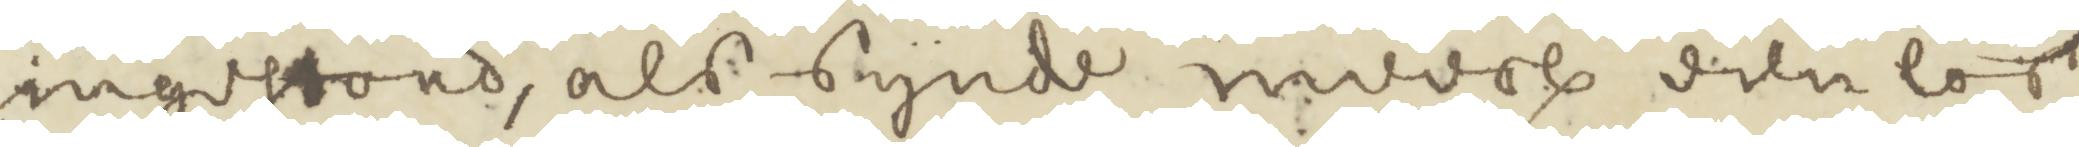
ingestord, als sijnde meest een los
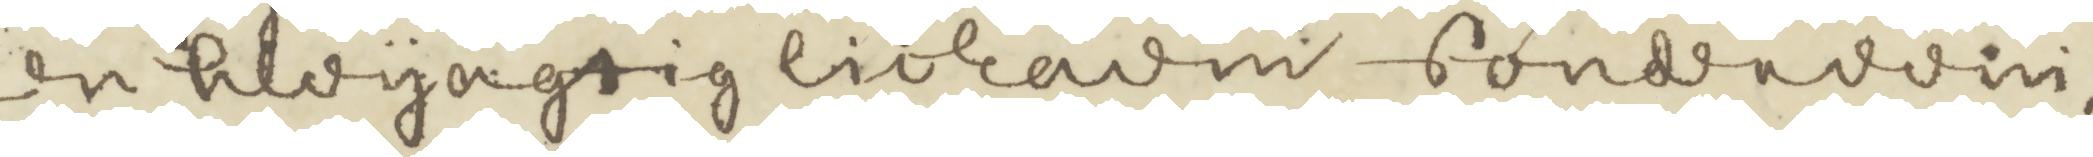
en kleijagtig lichaem sonder eeni
